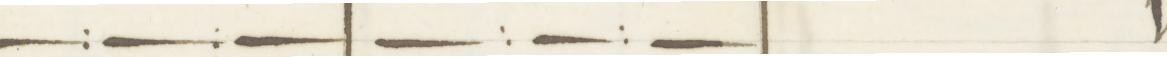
—:—:— —:—:— 1
